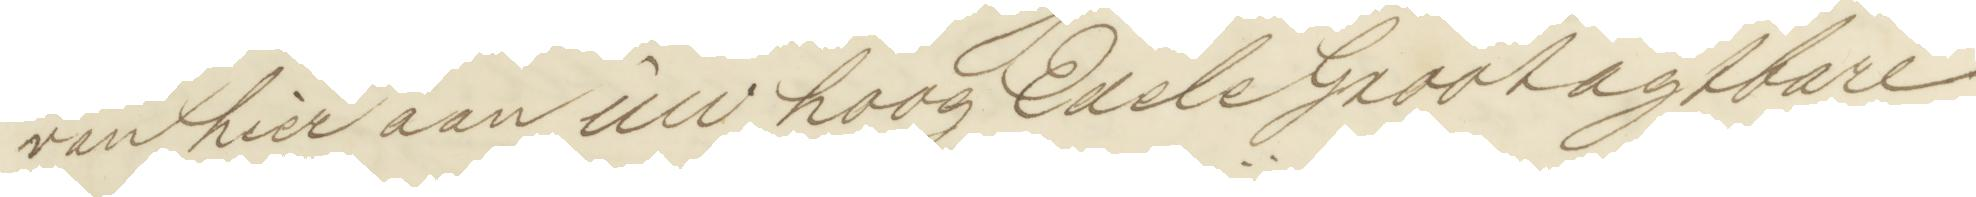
van hier aan uw hoog Edele Groot agtbare
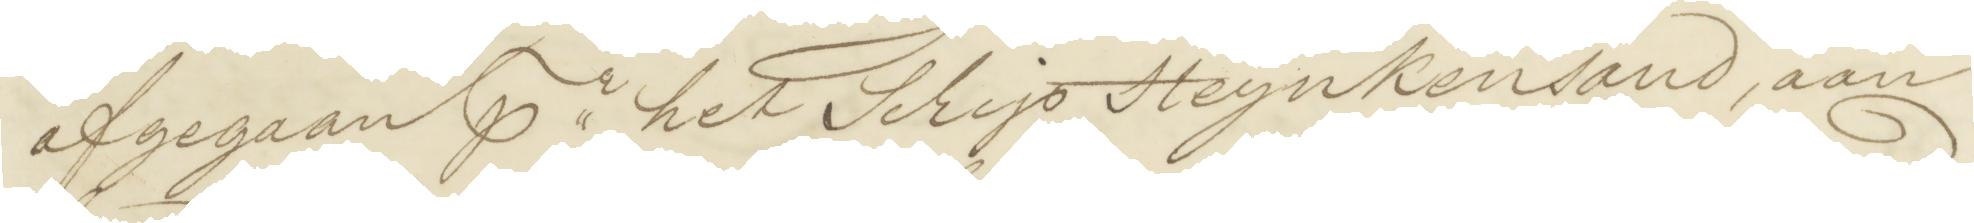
afgegaan p„r het schip Heijnkensand, aan
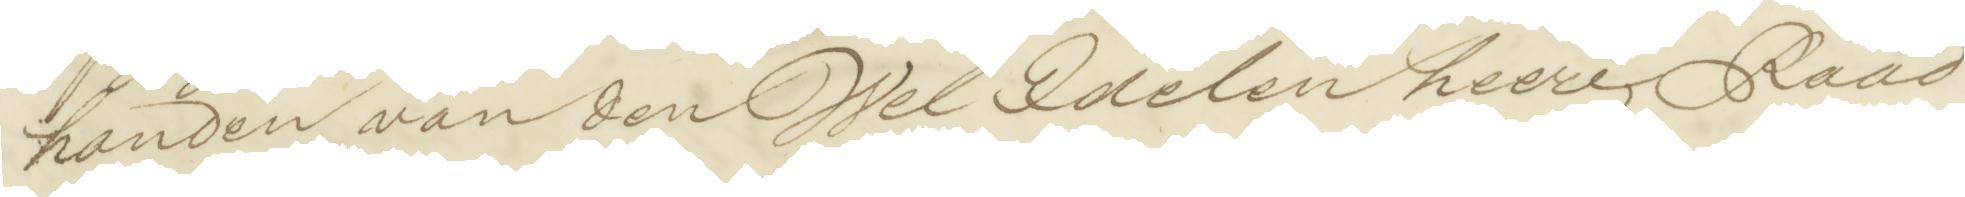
handen van den Wel Edelen heere Raad
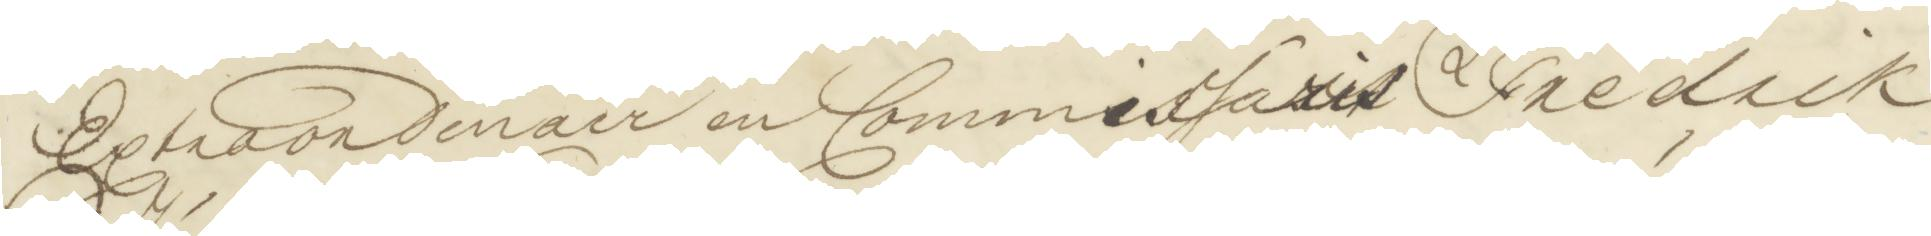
Extraordinair en Commissaris Fredrik
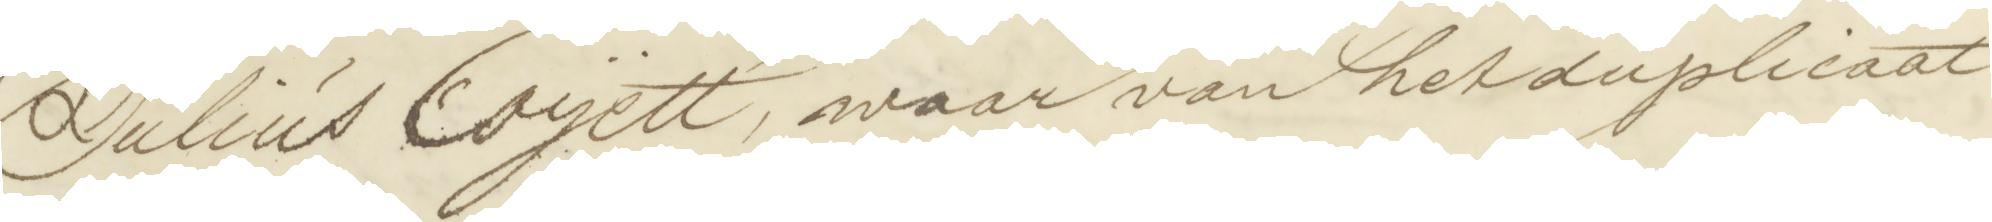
Julius Coijett, waar van het duplicaat
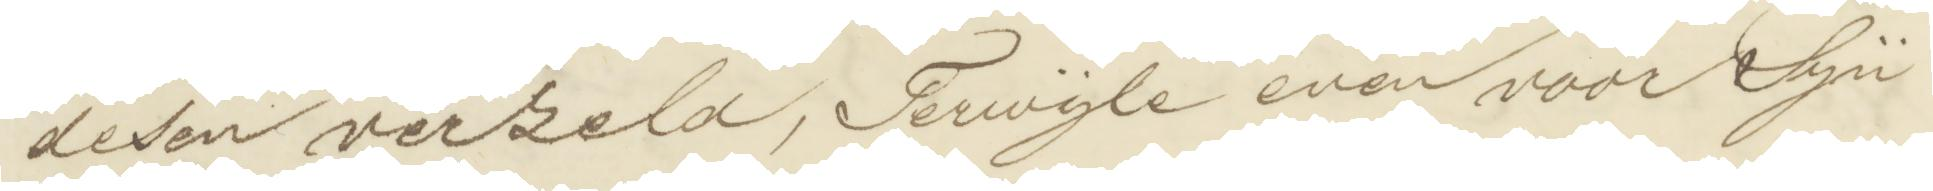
desen verzeld, Terwijle even voor sijn
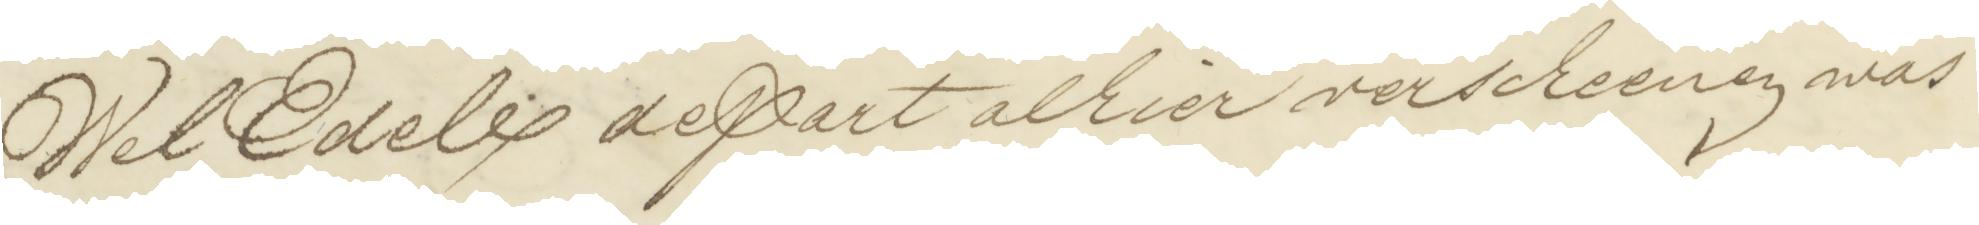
Wel Edele depart alhier verscheenen was
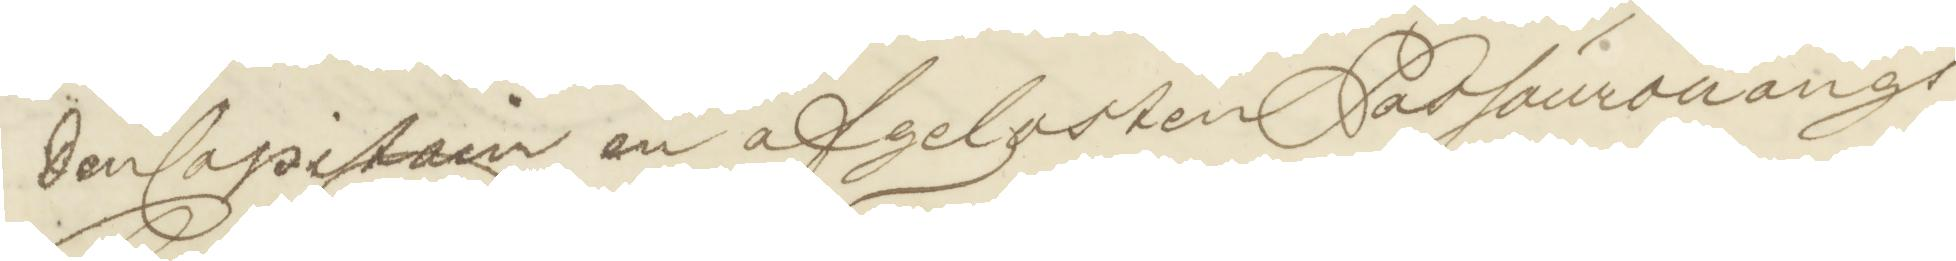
den Capitain en afgelosten Passourouangs
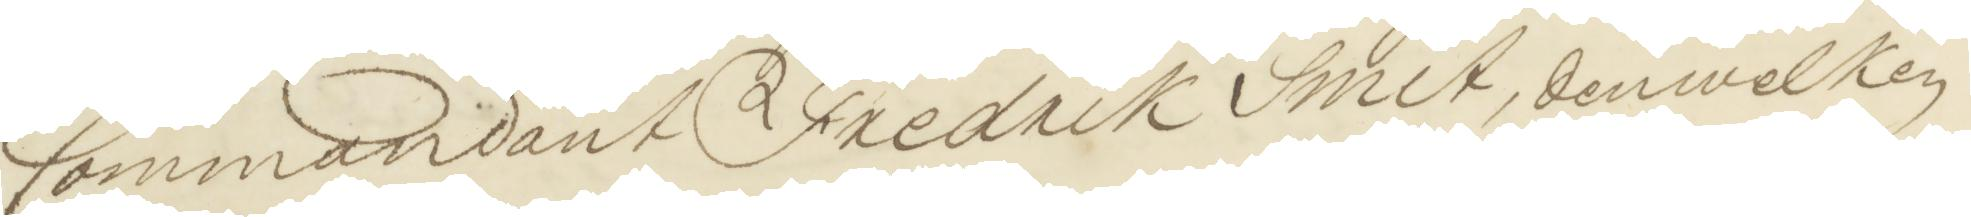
Commandant Fredrik Smit, den welken
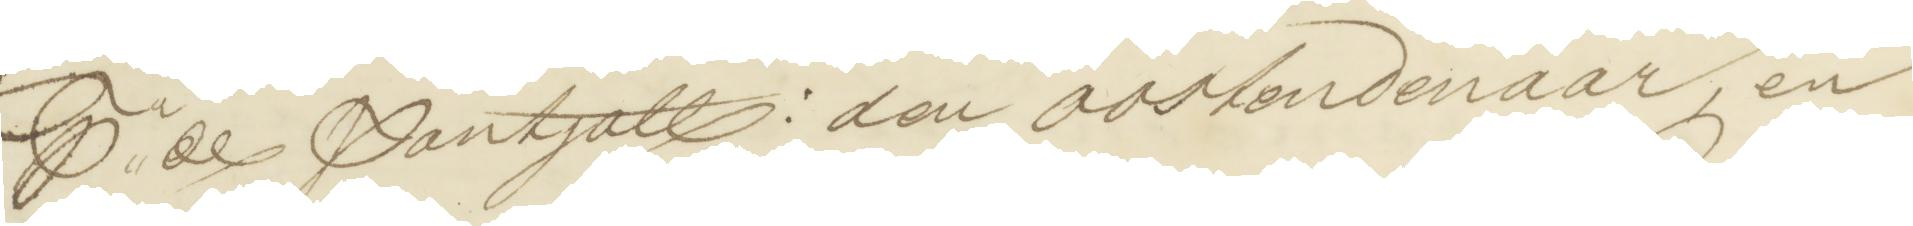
p„r de pantjall: den oostendenaar, en
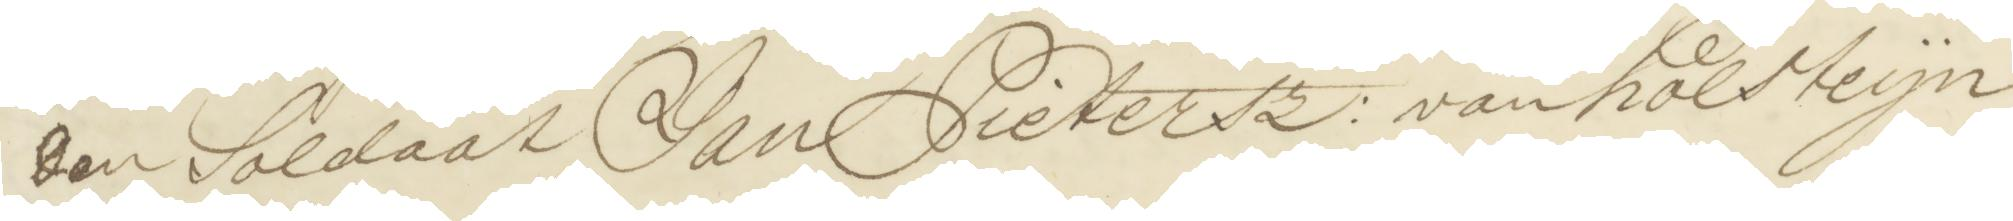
den soldaat Jan Pietersz: van holsteijn
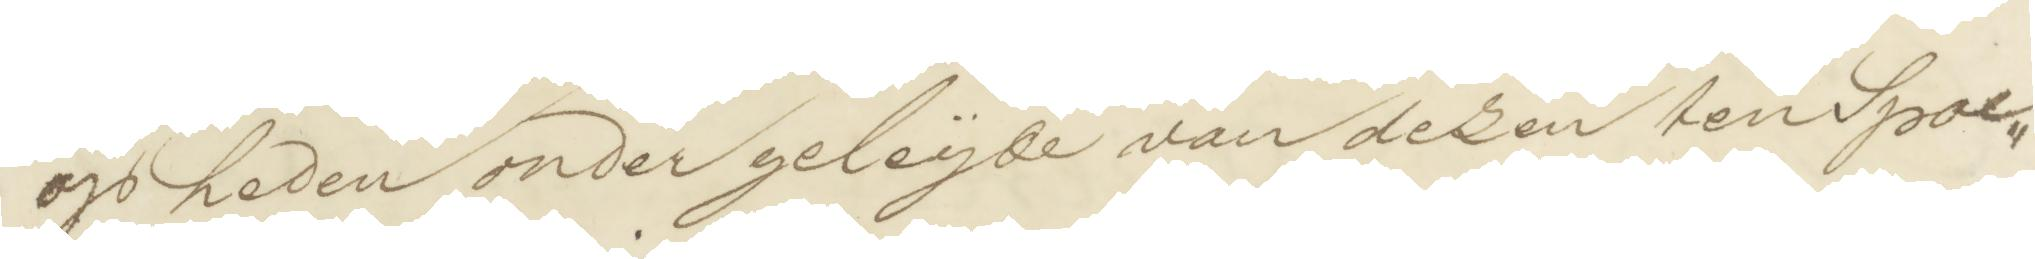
op heden onder geleijde van dezen ten spoe„
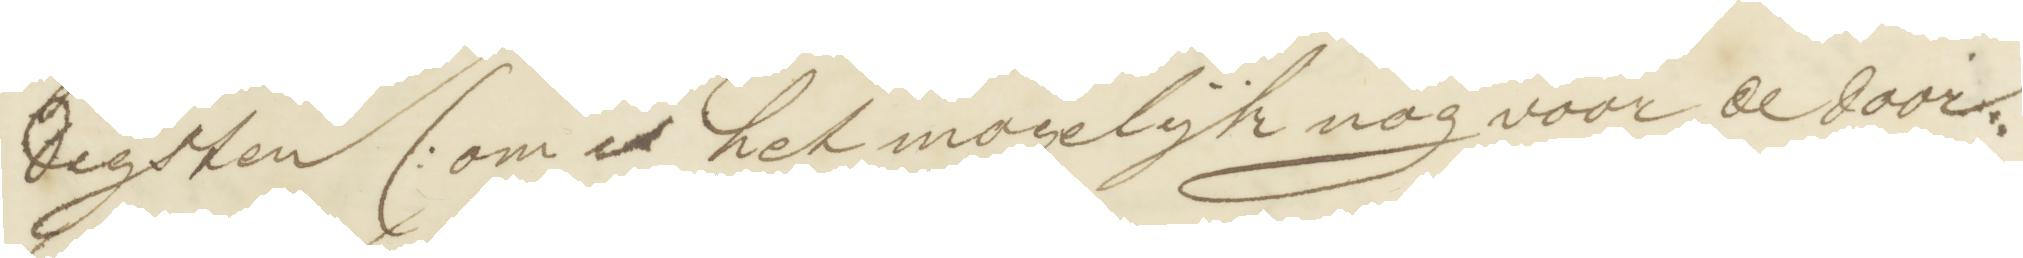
digsten (:om is het mogelijk nog voor de door„
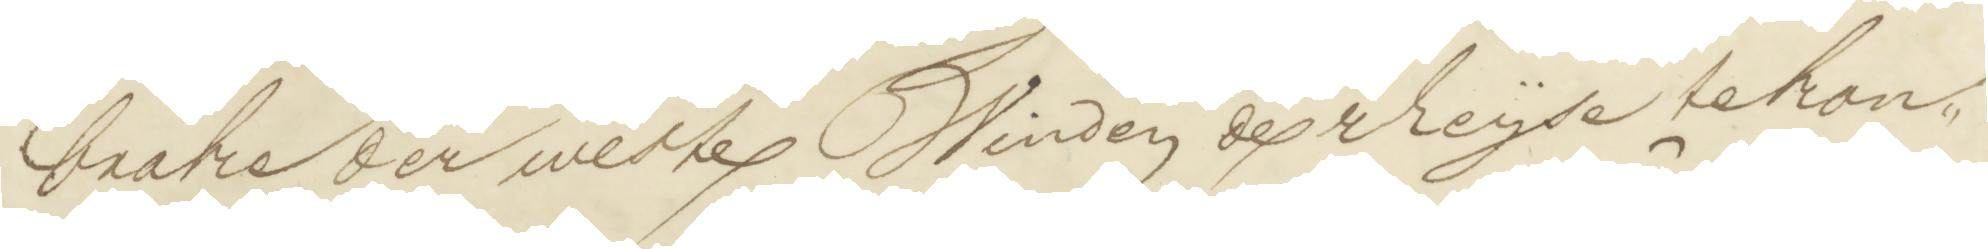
brake der weste Winden de rheijse tekon„
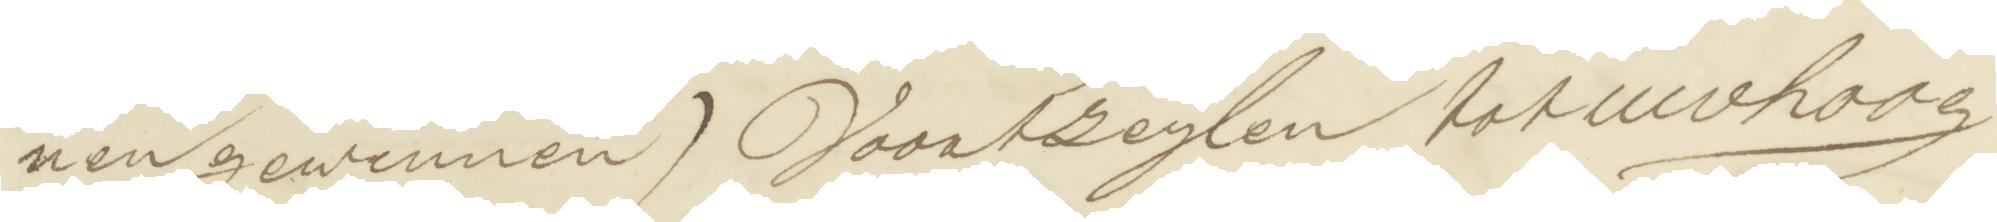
nen gewinnen) Voortzeijlen tot uwhoog
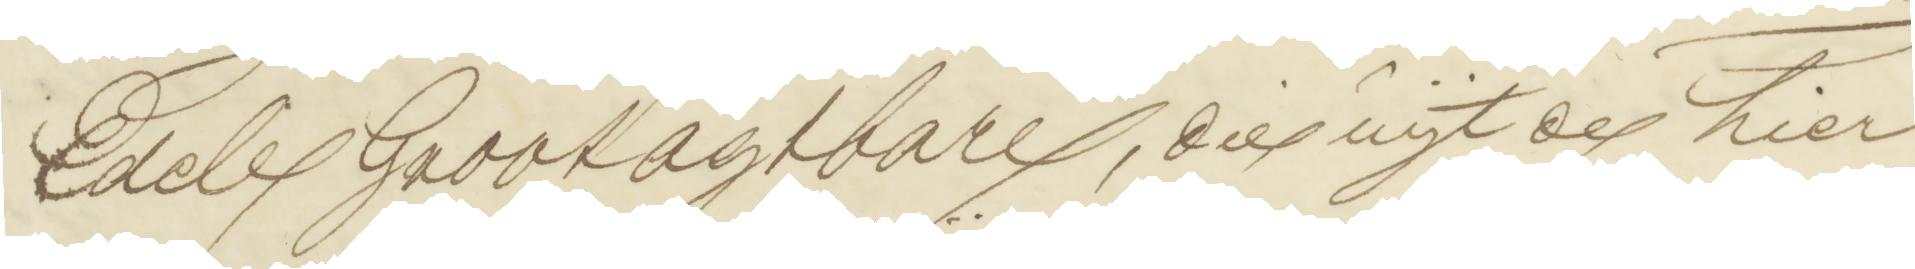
Edele Groot agtbare, die uijt de hier
